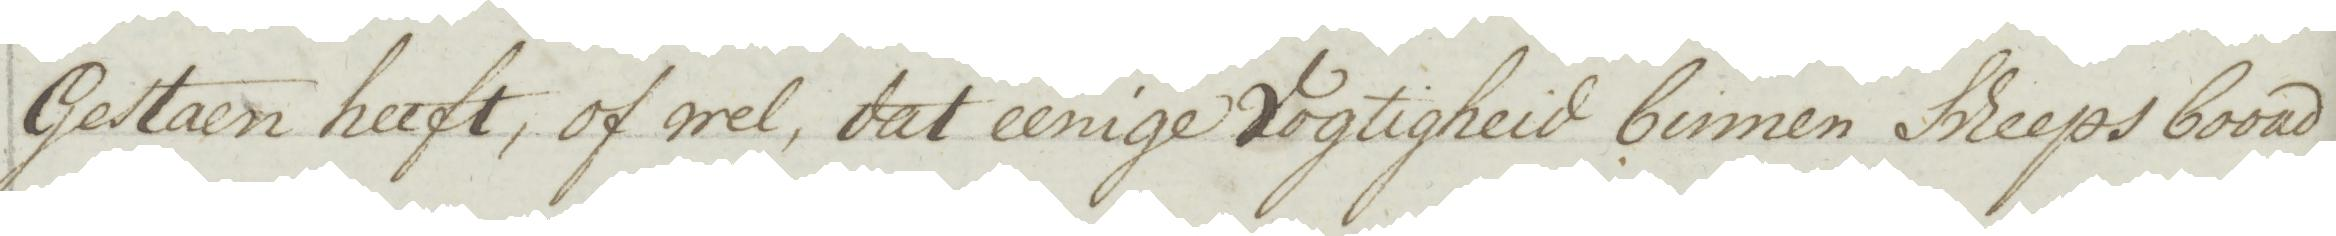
Gestaen heeft, of wel, dat eenige vogtigheid binnen scheeps boord
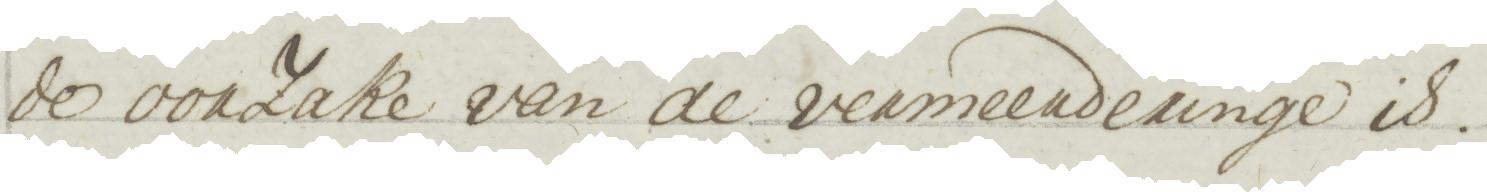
de oorzake van de vermeerderinge is.
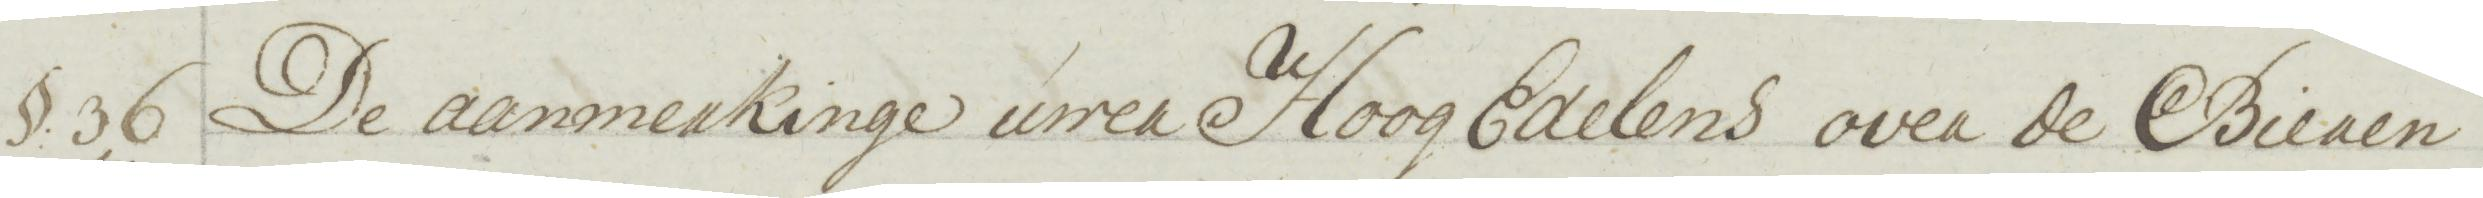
§. 36 De aanmerkinge uwer Hoog Edelens over de Bieren
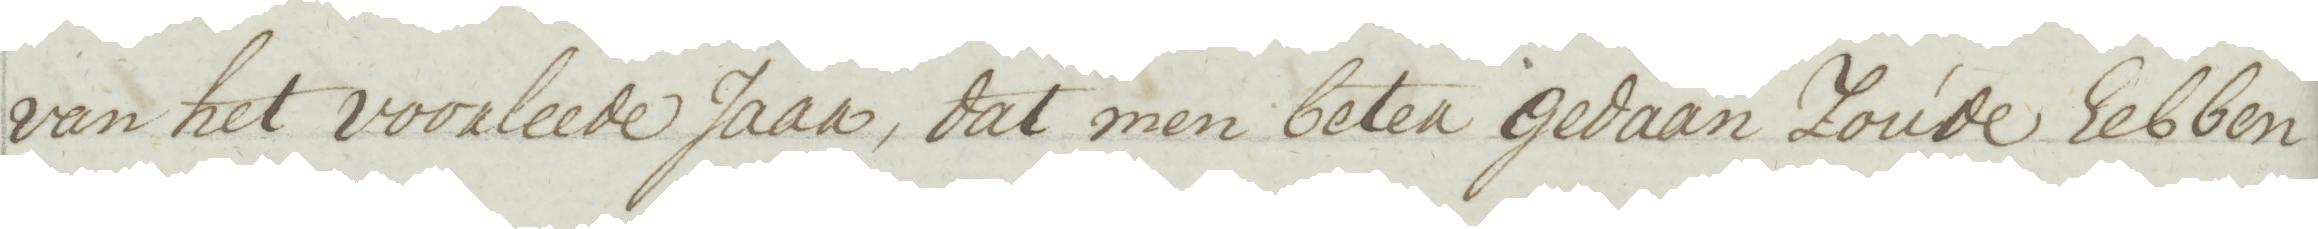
van het voorleede Jaar, dat men beter gedaan zoude hebben
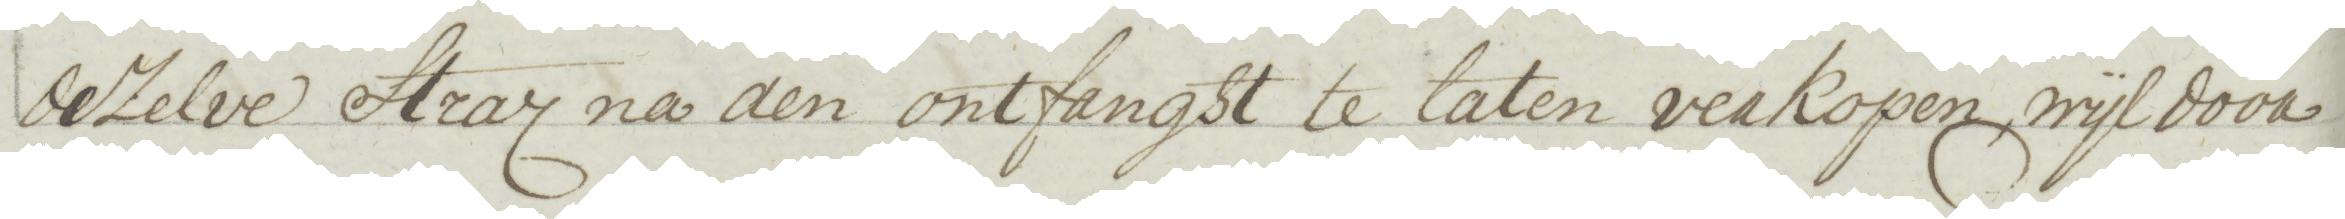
dezelve strax na den ontfangst te laten verkopen, wijl door
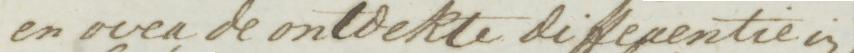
en over de ontdekte differentie in
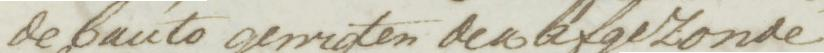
de bruto gewigten der afgezonde
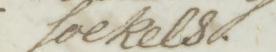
soekels.
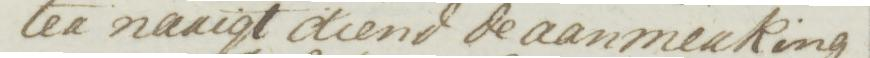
ter narigt diend de aanmerking
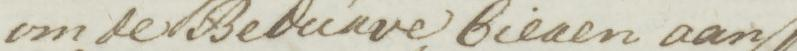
om de Bedurve bieren aan„
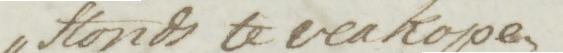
„stonds te verkopen
